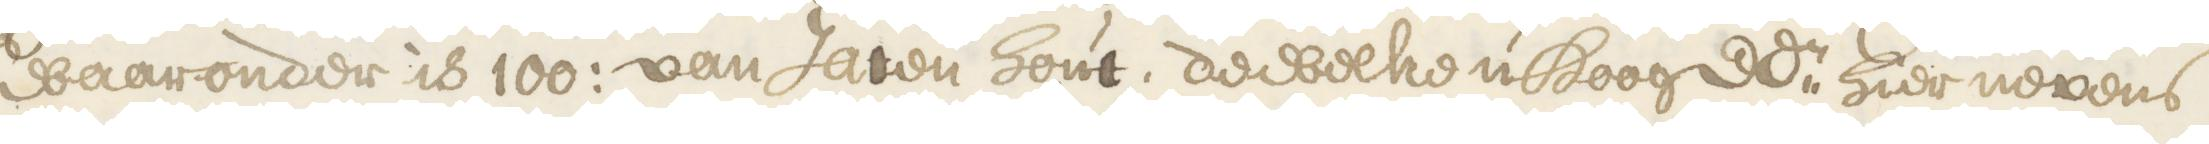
waaronder is 100: van Jaten hout, dewelke u Hoog Ed„n hier nevens
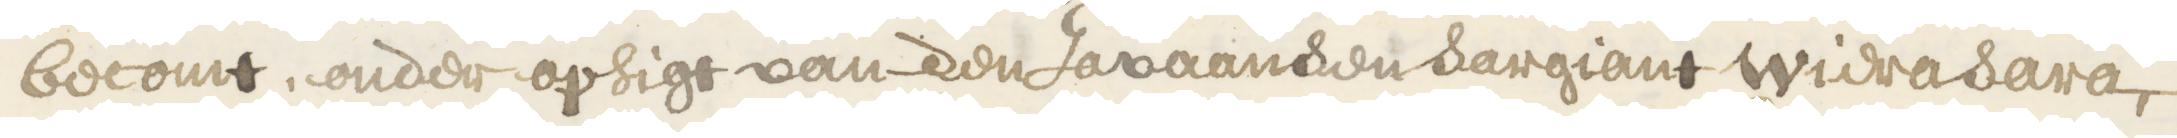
becomt, onder opsigt van den Javaansen sargiant Wierasara,
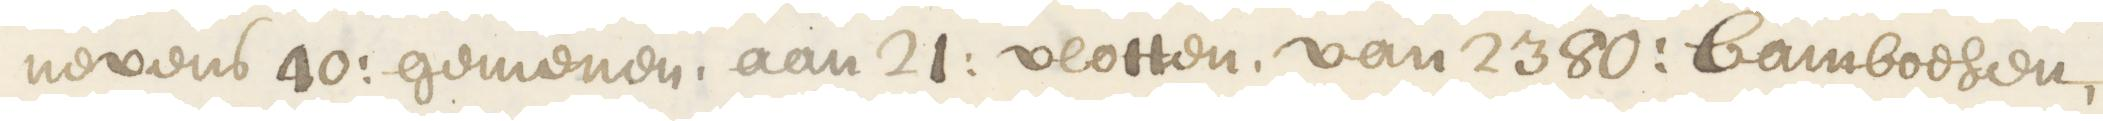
nevens 40: gemenen, aan 21: vlotten, van 2380: Bamboesen,
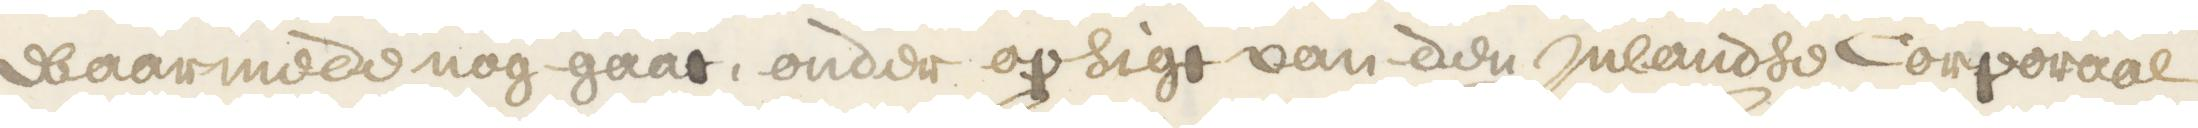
waarmede nog gaat, onder op sigt van den Inlandse Corporaal
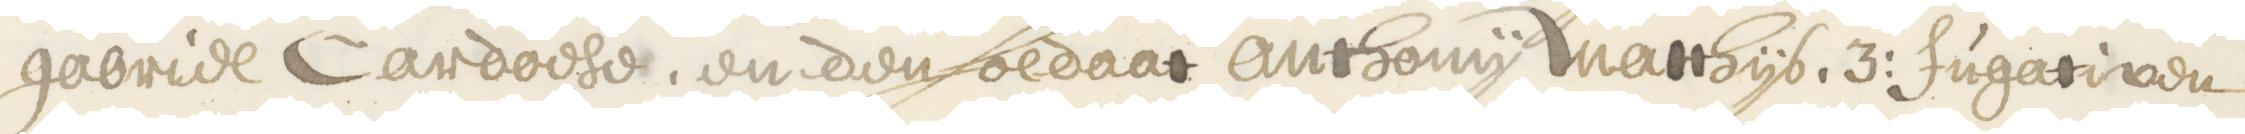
gabriel Cardoese, en den oldaat Anthonij Matthijs. 3: fugativen
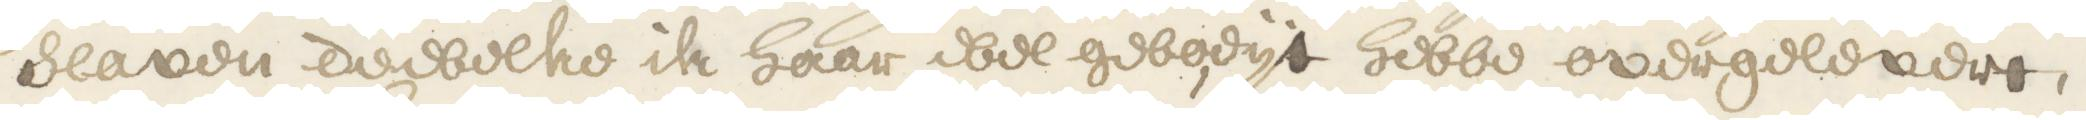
slaven dewelke ik haar wel geboeijt hebbe overgelevert,
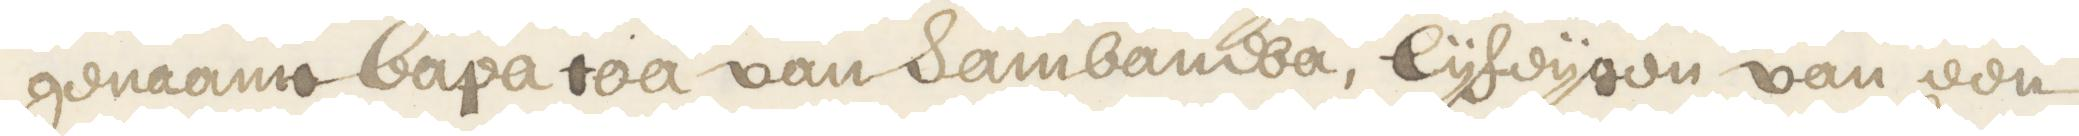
genaamt bapatoa van sambauwa, lijfeijgen van een
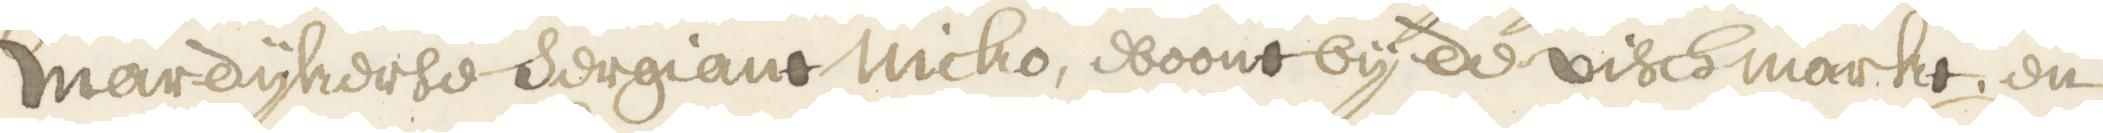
Mardijkerse sergiant Nicko, woont bij de vischmarkt, en
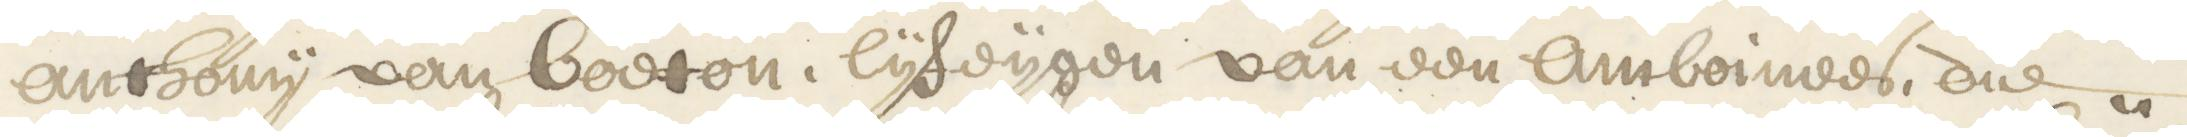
anthonij van boeton, lijfeijgen van een Amboinees, die
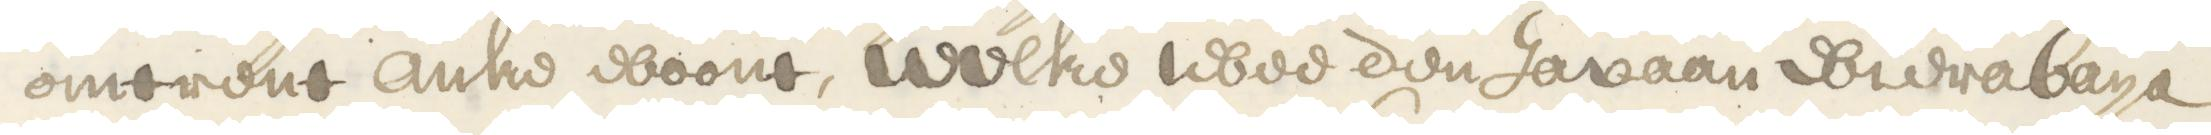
omtrent Anke woont, welke twee den Javaan wierabaija
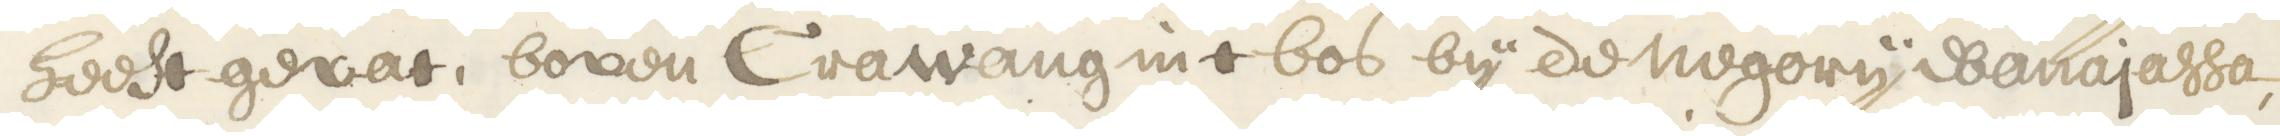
heeft gevat, boven Crawang in't bos bij de negorij wanajassa,
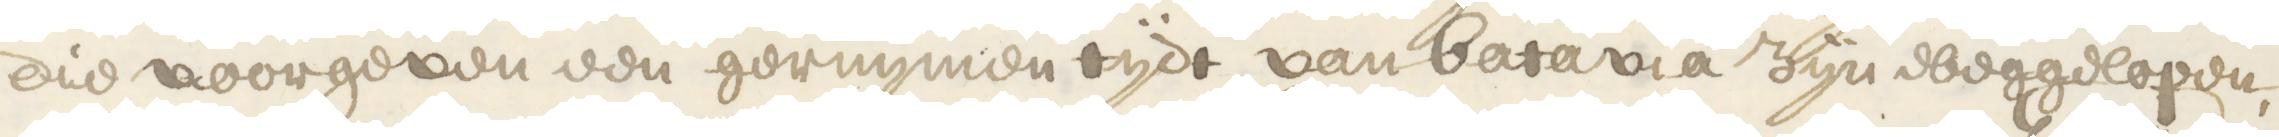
die voorgeven een geruijmen tijdt van batavia zijn weggelopen,
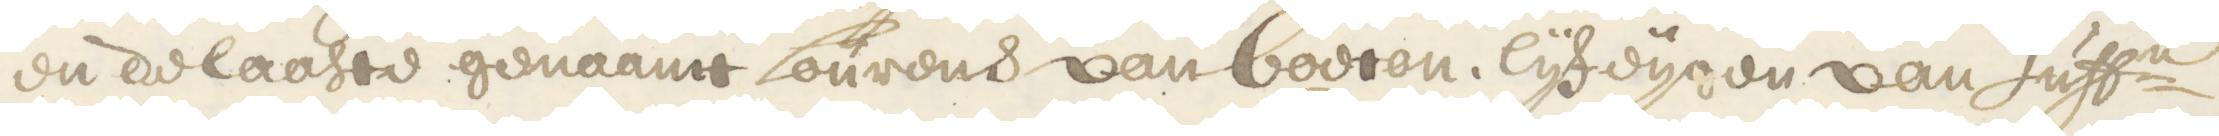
en de laaste genaamt lourens van boeton, lijfeijgen van Juff=n
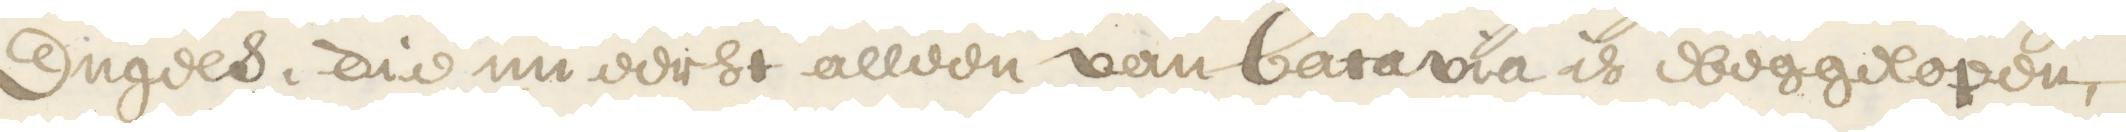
Engels, die nu eerst alleen van batavia is weggelopen,
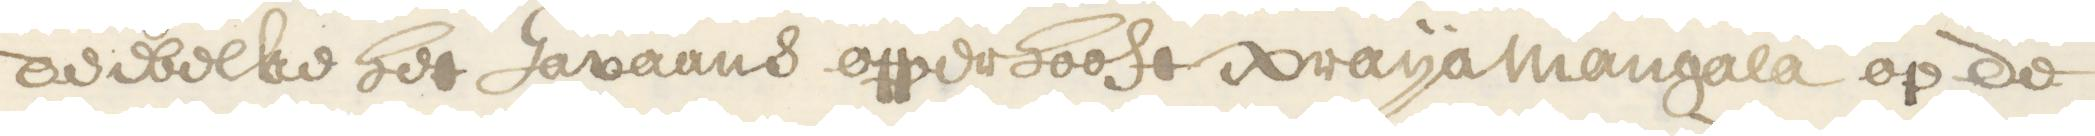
de welke het Javaans opperhooft praija mangala op de
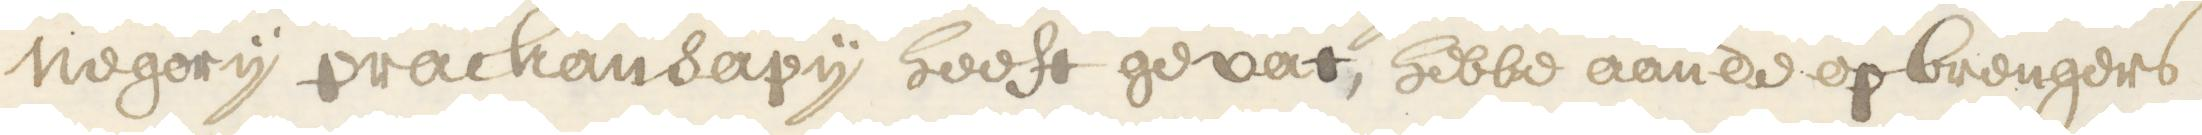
negorij prackansapij heeft gevat, hebbe aan de opbrengers
